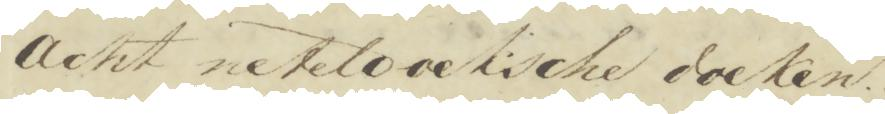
Acht neteldoeksche doeken.
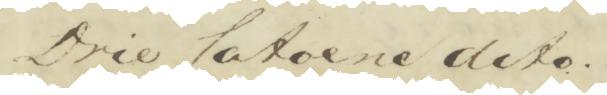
Drie Catoene dito.
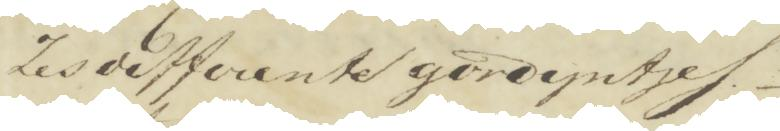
Zes differente gordepitjes. —
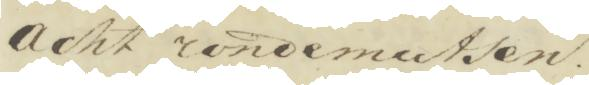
Acht rondemutsen.
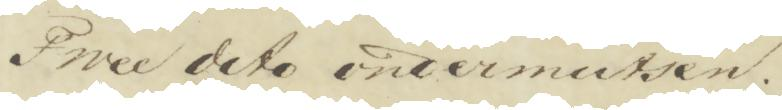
Twee dito ondermutsen.
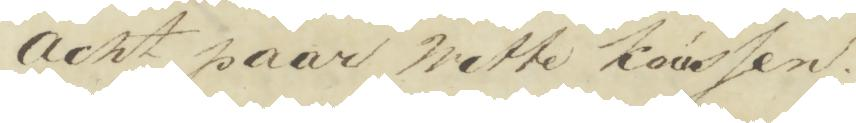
Acht paar Witte koussen
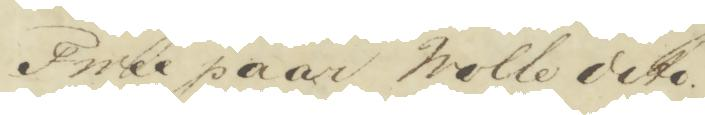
Twee paar Wolle dito.
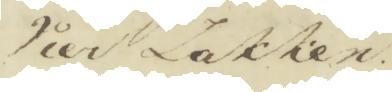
Vier Zakken
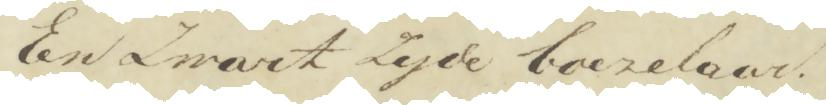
Een zwart zyde boezelaar.
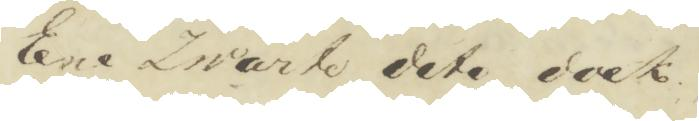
Eene zwarte dito doek.
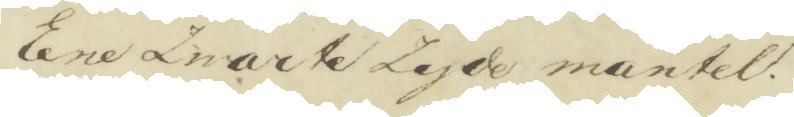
Eene zwarte zyde mantel.
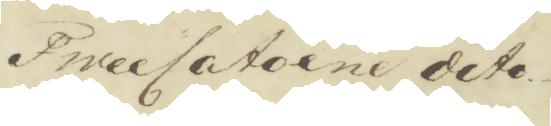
Twee Catoene dito.
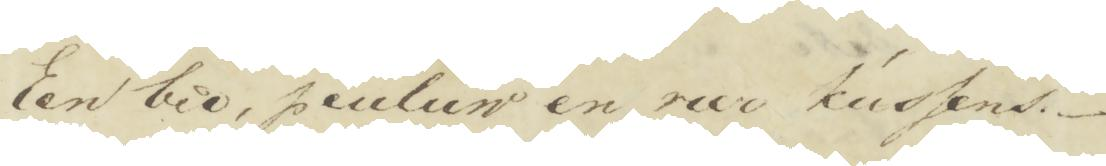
Een bed, peuluw en vier kussens. —
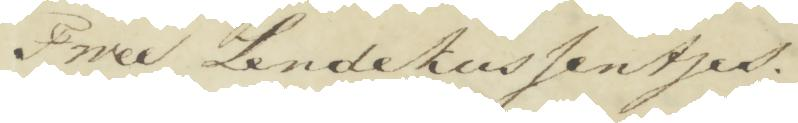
Twee Lendekussentjes.
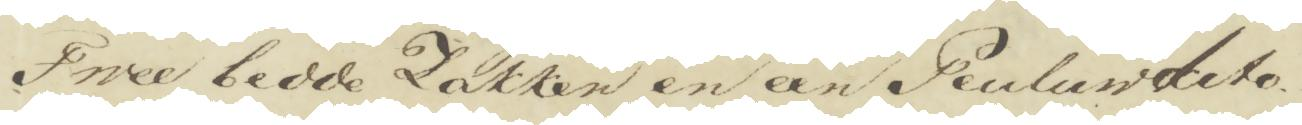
Twee bedde zakken en een Peuluw dito.
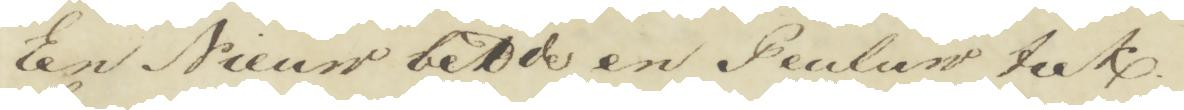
Een Nieuw bedde en Peuluw teek.
